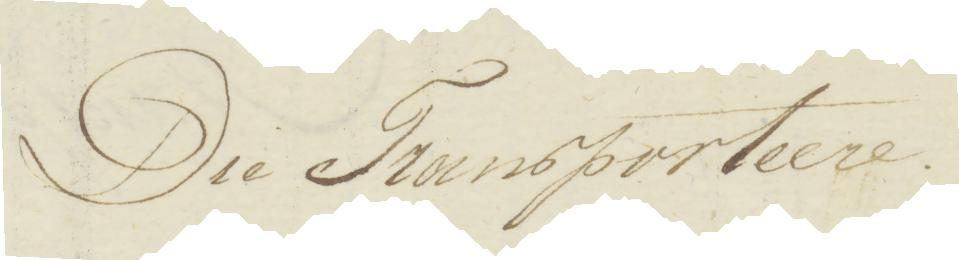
Die Transporteere.
